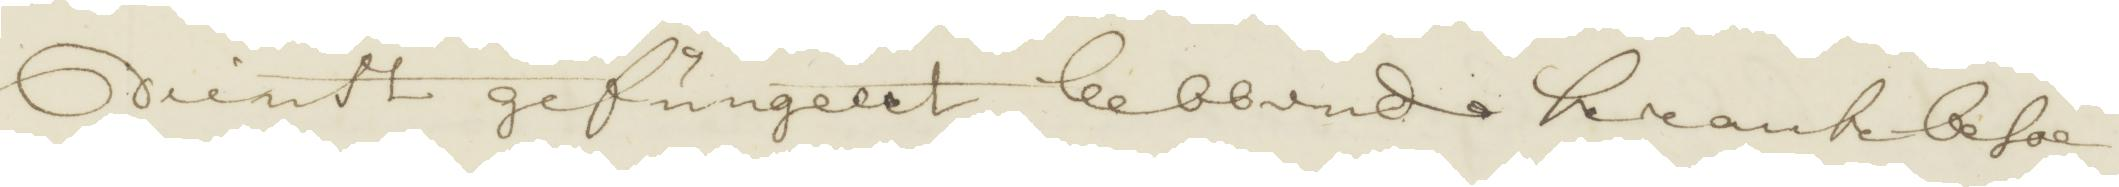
dienst gefungeert hebbende krank besoe
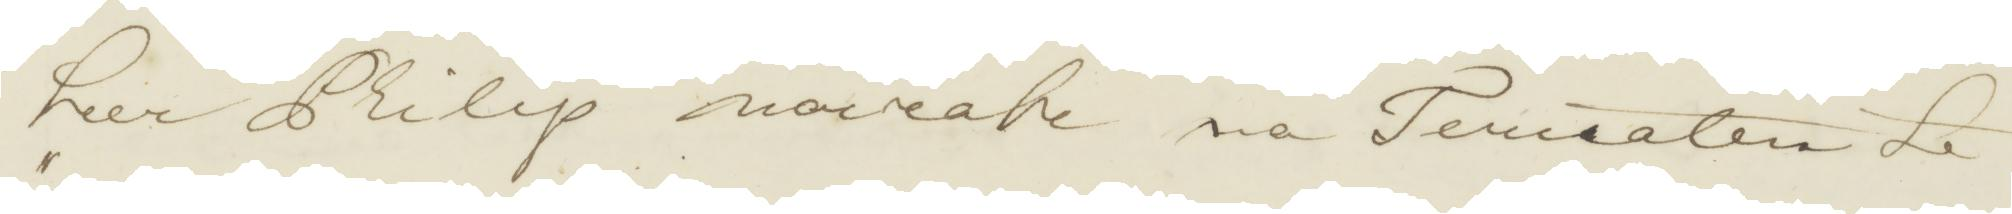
„ker Philip noirak na Ternaten te
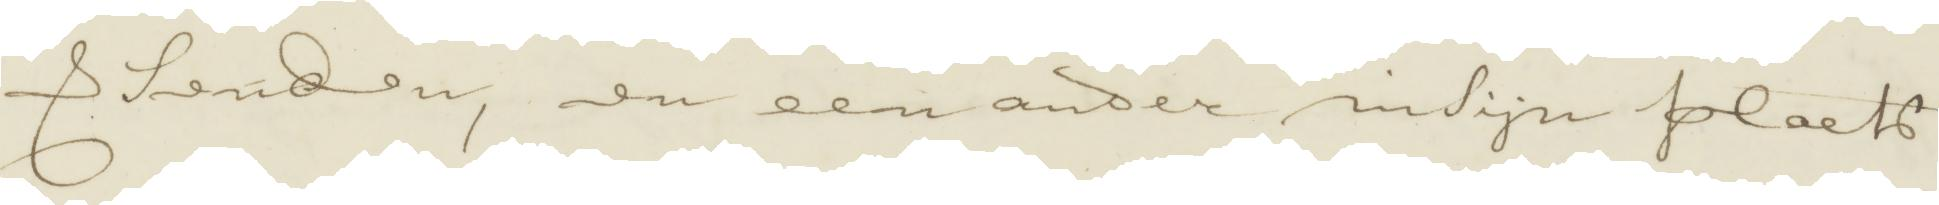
versenden, en een ander insijn plaets
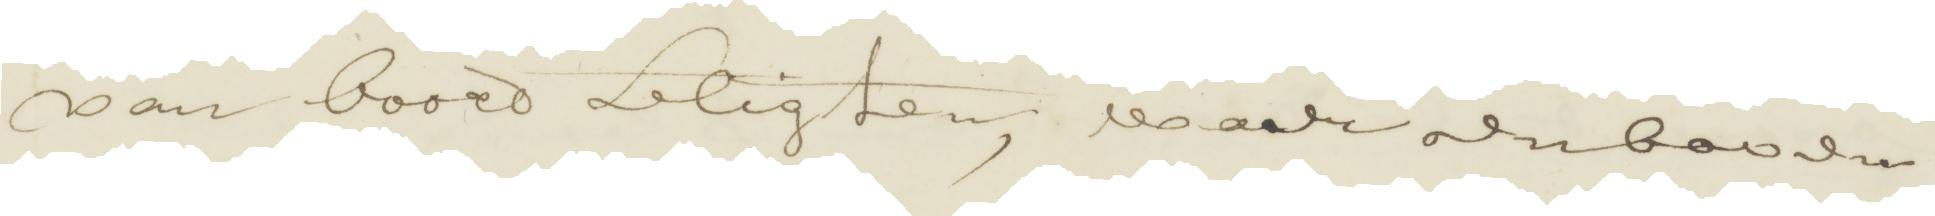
van boord teligten, waer enboven
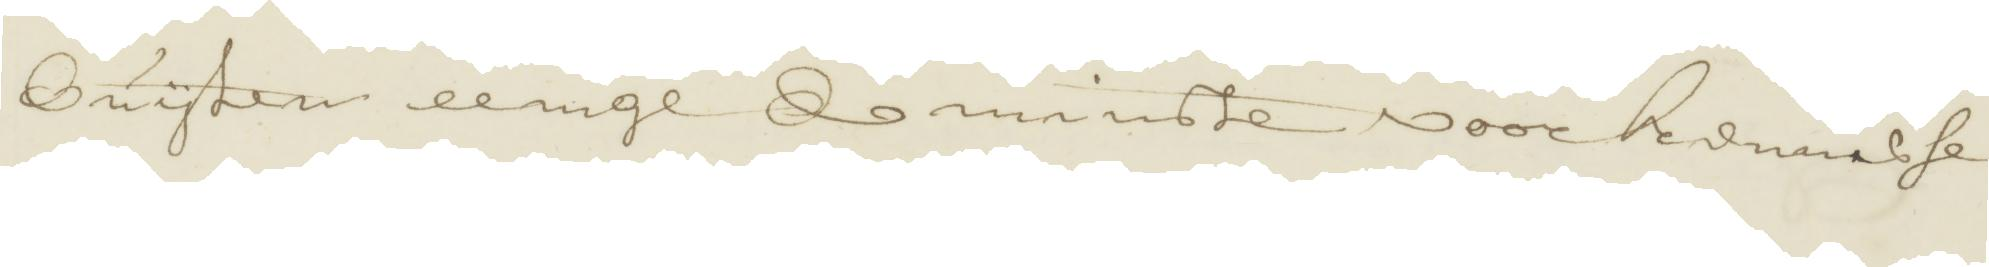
buijten eenige de minste voor kennisse
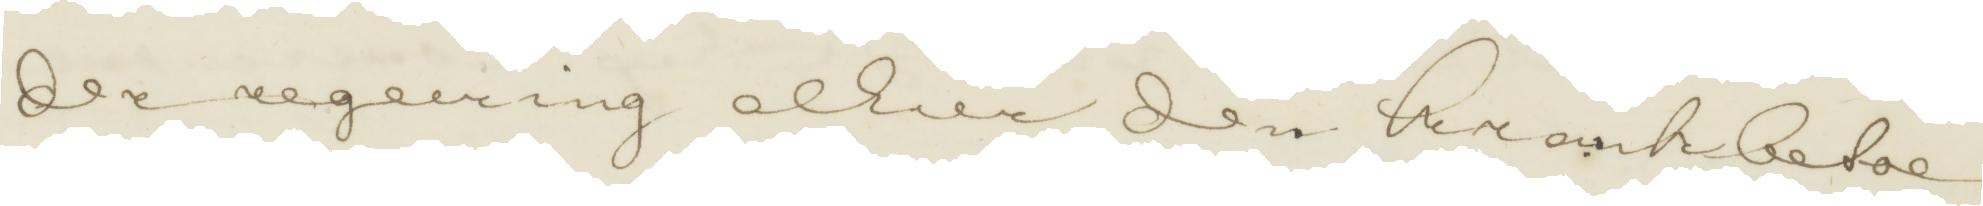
der regeering alhier, den krank besoe
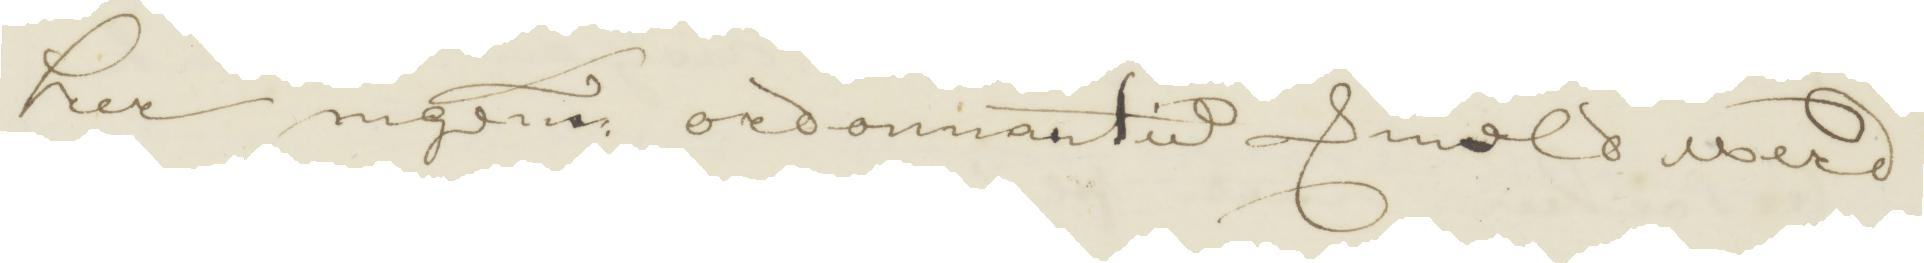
ker ingem: ordonnantie vermeld werd
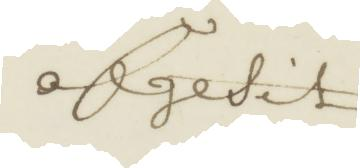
afgesit
